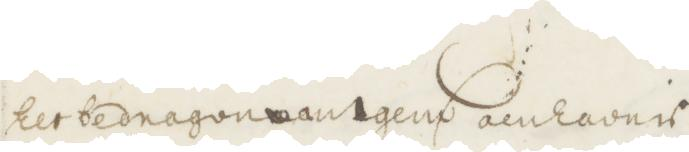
het bedrage van tgene aen haer is
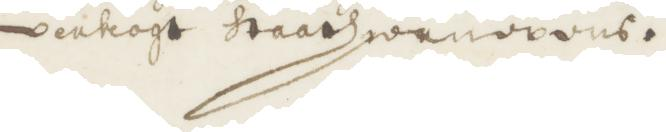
verkogt staath er nevens.
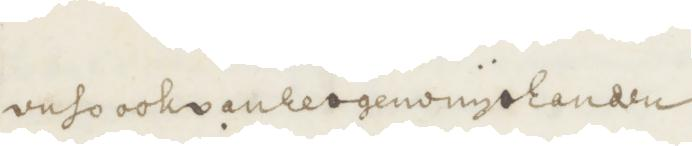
enso ook van het gene uijthanden
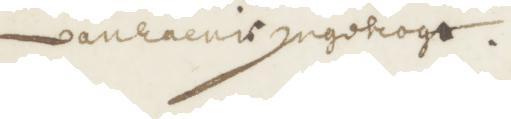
van haer is ingekogt.
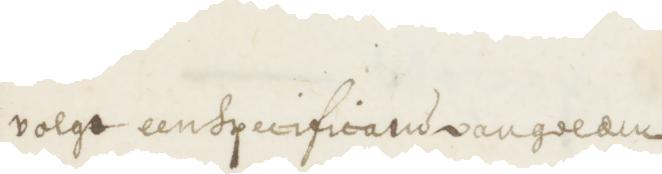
volgt een specificatie van gelden
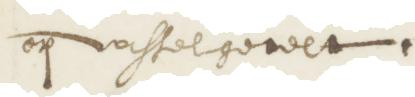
op wissel getelt.
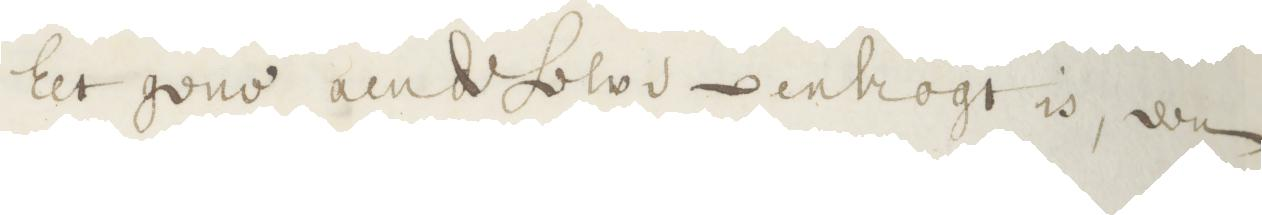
het gene aen deselve verkogt is, een
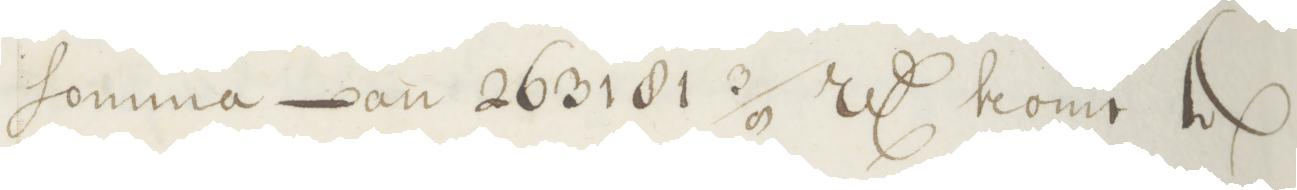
somma van 263181 3/8 RE komt te
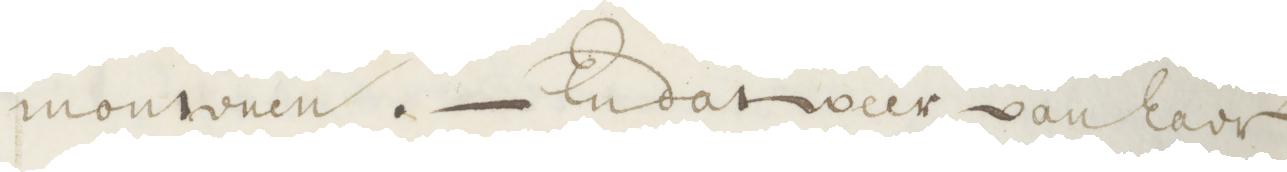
monteren.- Endat weer van haer
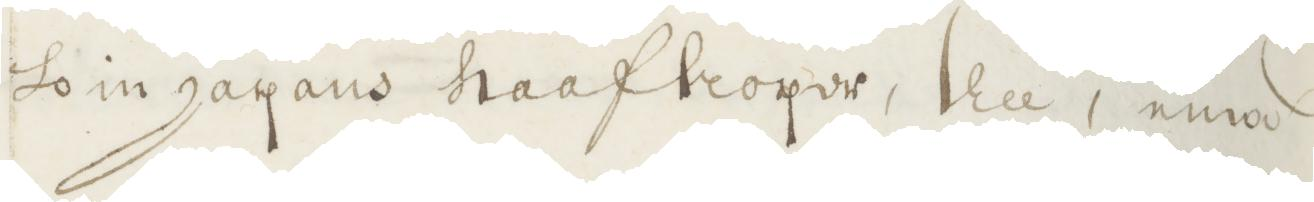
so in japans staafkoper, thee, ruwe
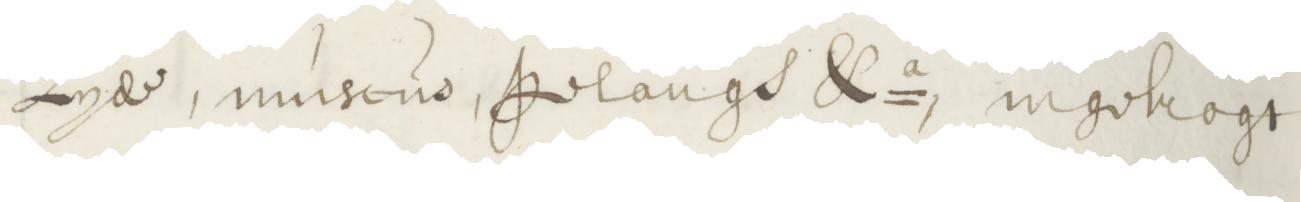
zijde, miscus, Pelangs &=a, ingekogt
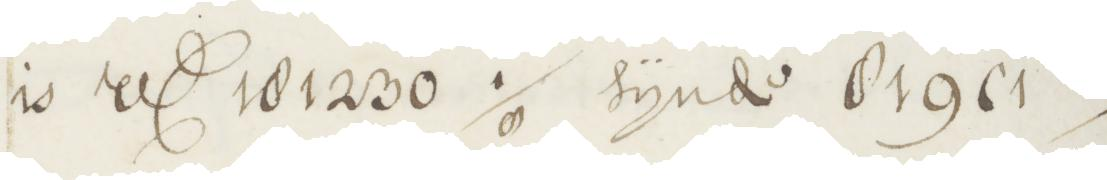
is RE 181230 1/8 sijnde 81951 ¼
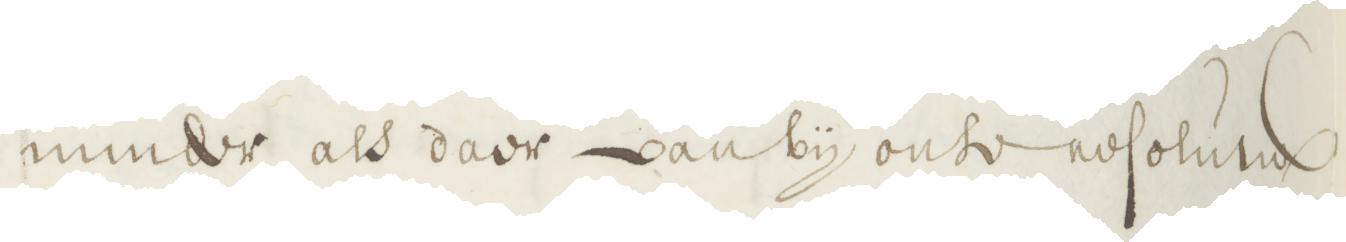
minder als daer van bij onse resolutie
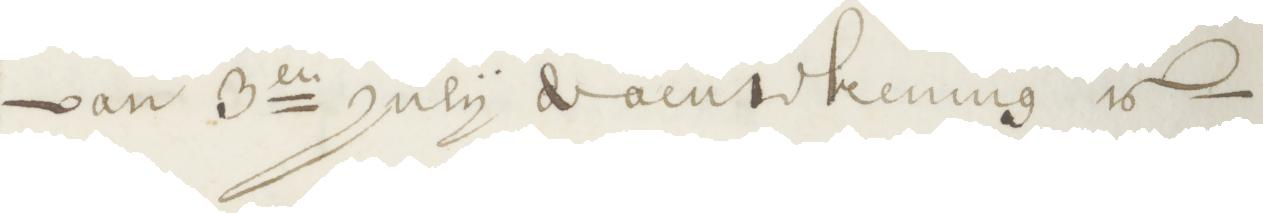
van 3=en julij de aentekening is
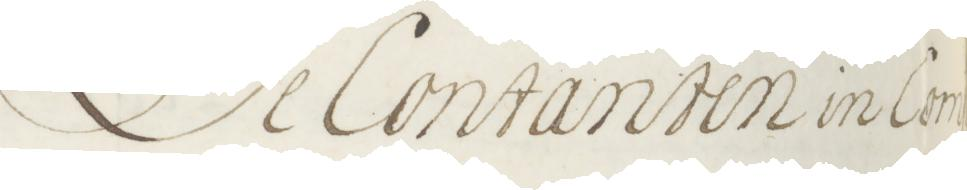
De Contanten in Com
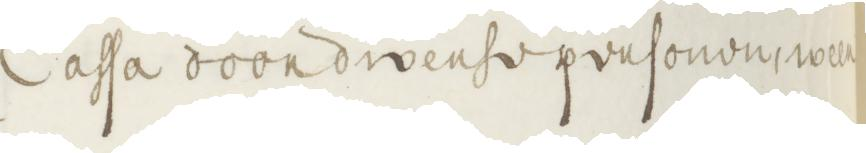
Cassa door diverse personen, weer
